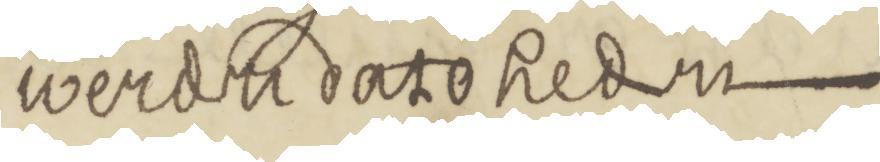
werden dato heden
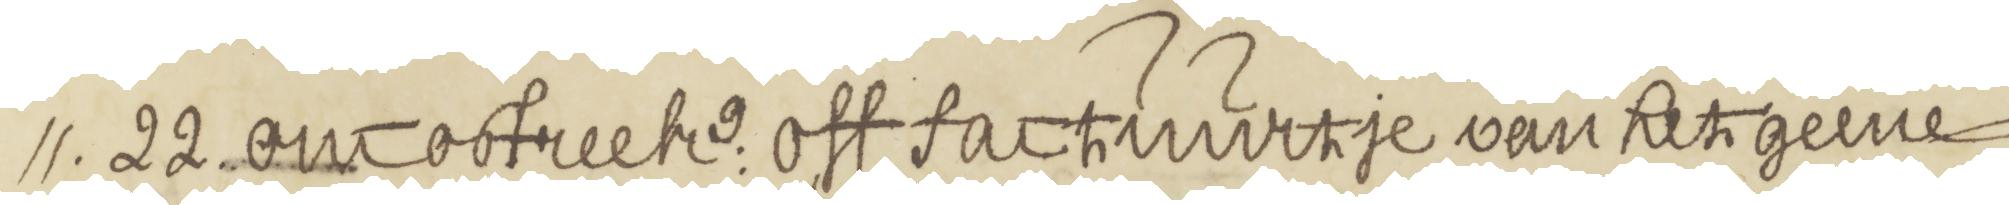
„. 22. oncostreek:g off factuurtje van het geene
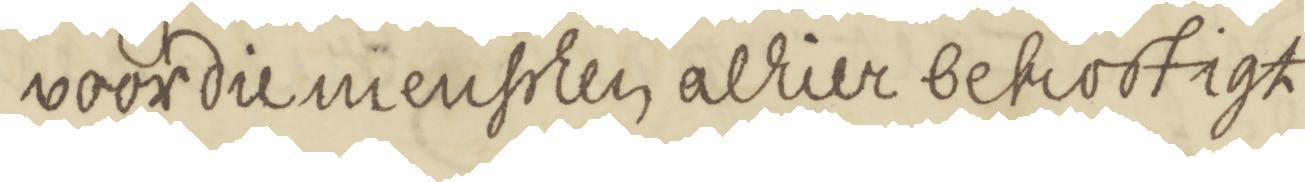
voor die menschen alhier bekostigt
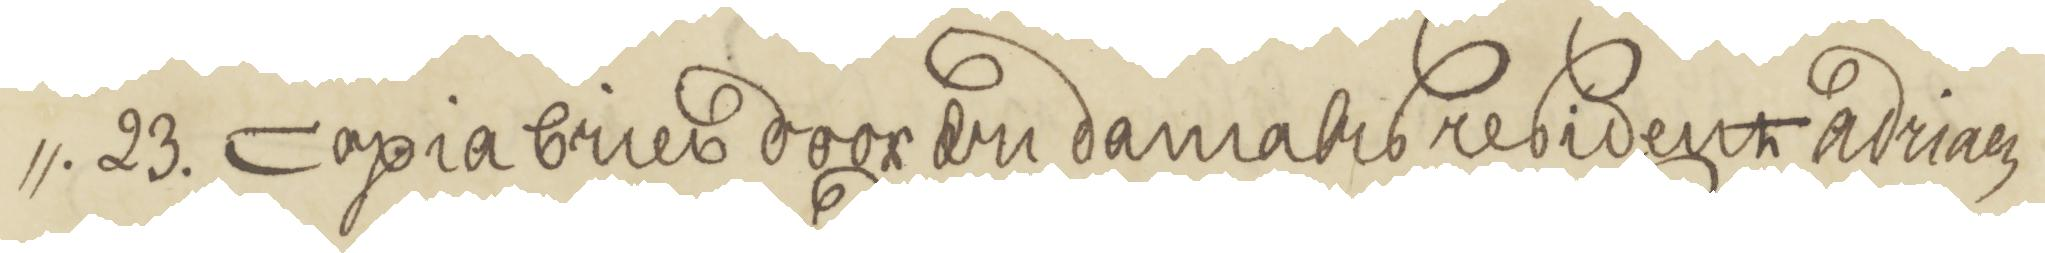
„. 23. copia briev door den damaks resident adriaen
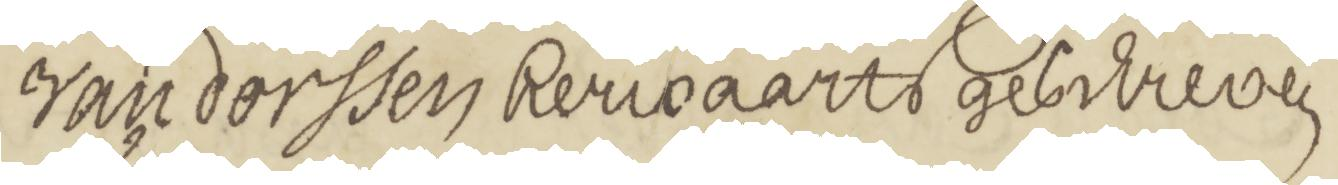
van dorssen herwaarts geschreven
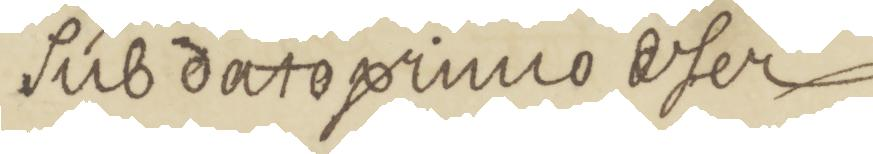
sub dato primo deser
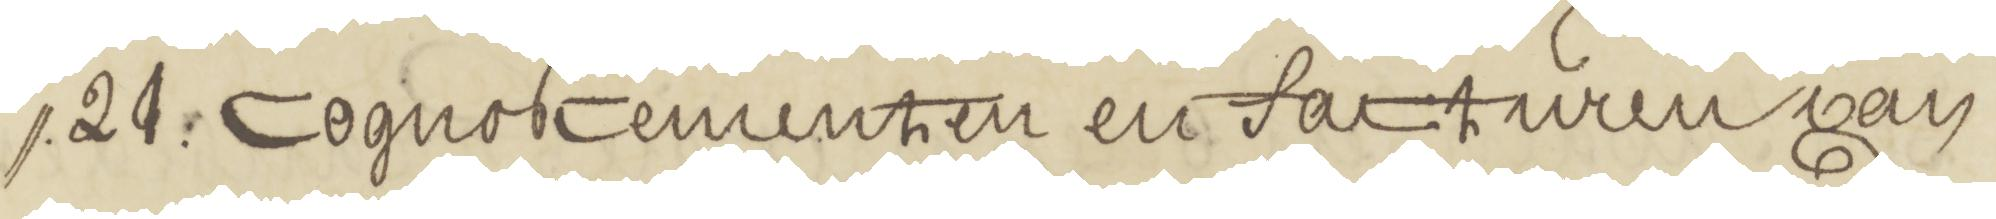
„. 24: cognoscementen en facturen van
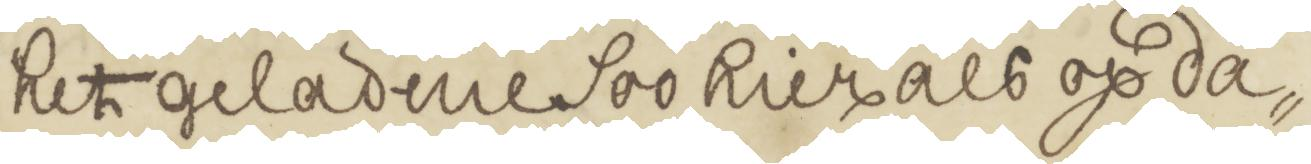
het geladene soo hier als op da„
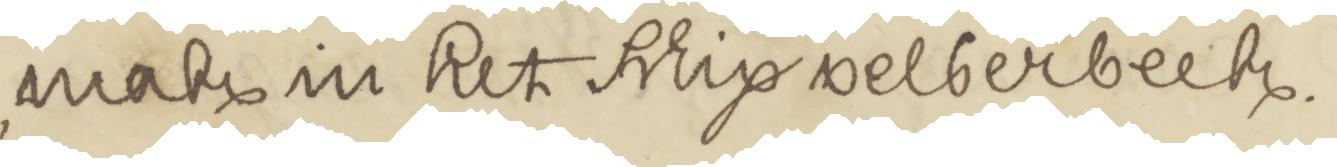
„mak in het schip velserbeek.
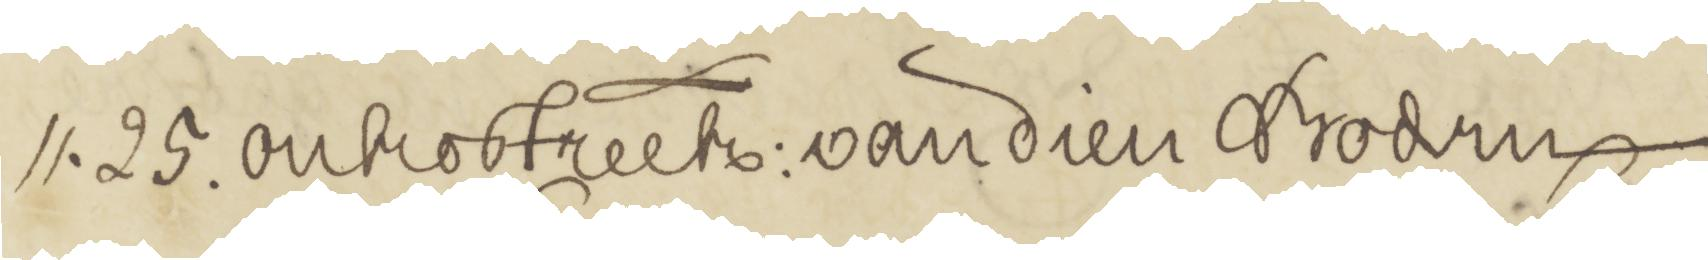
„. 25. onkostreek: van dien Bodem.
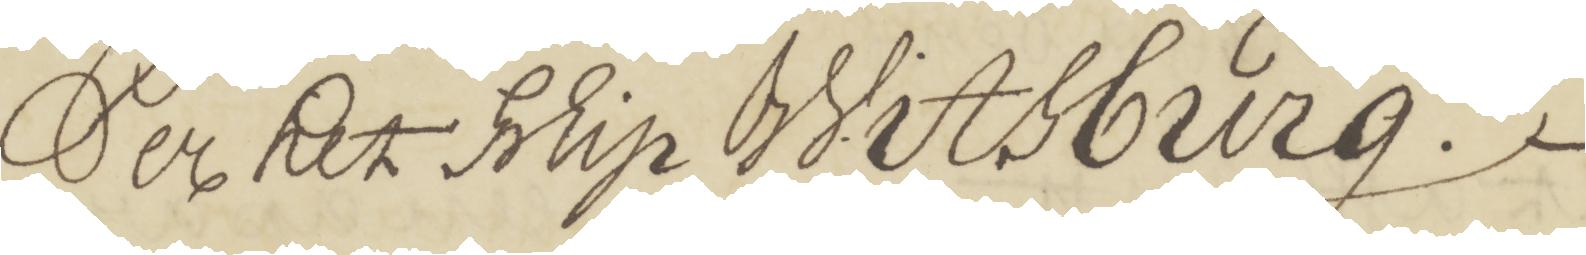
Per het schip Witsburg. -
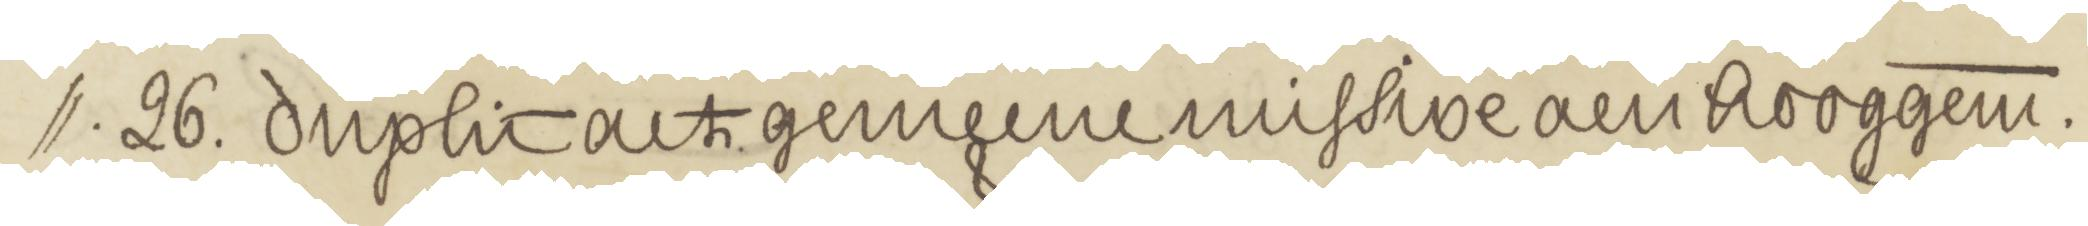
„. 26. duplicaet gemeene missive aen hooggem:
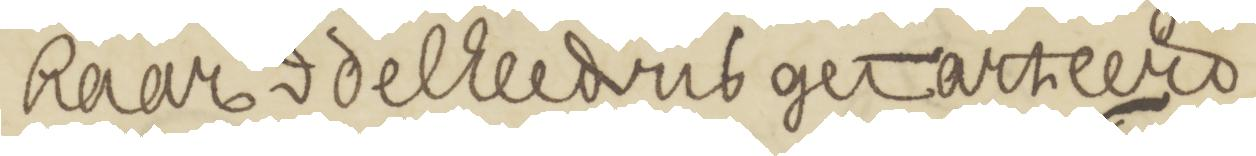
haar Edelheedens gecarteerd
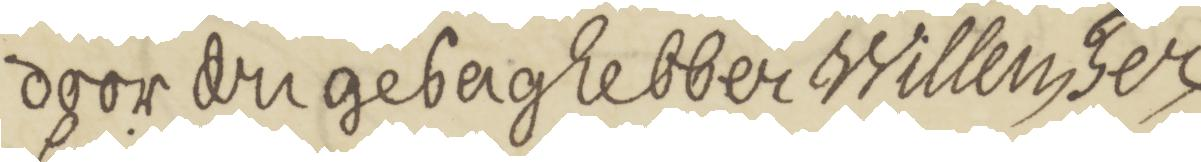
door den gesaghebber Willem Ter
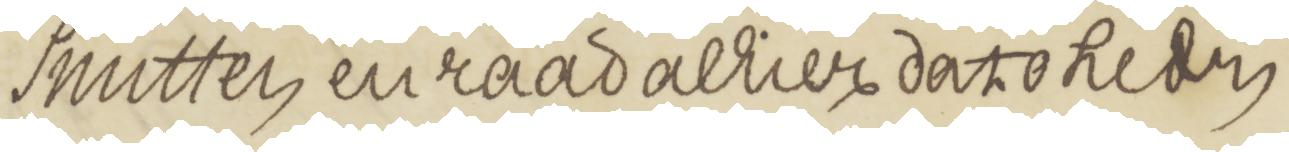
smitten en raad alhier dato heden
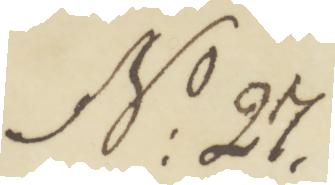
N:o 27.
